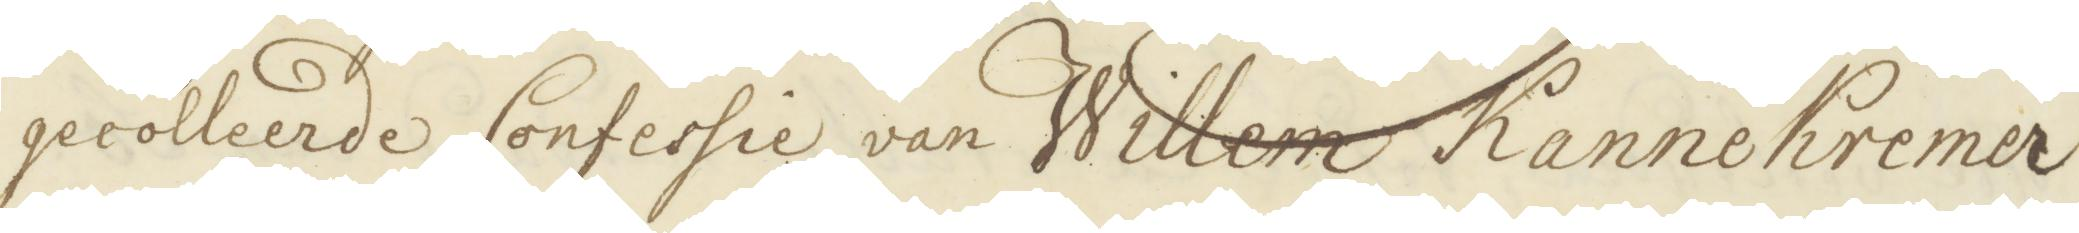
gecolleerde confessie van Willem Kanne Kremer
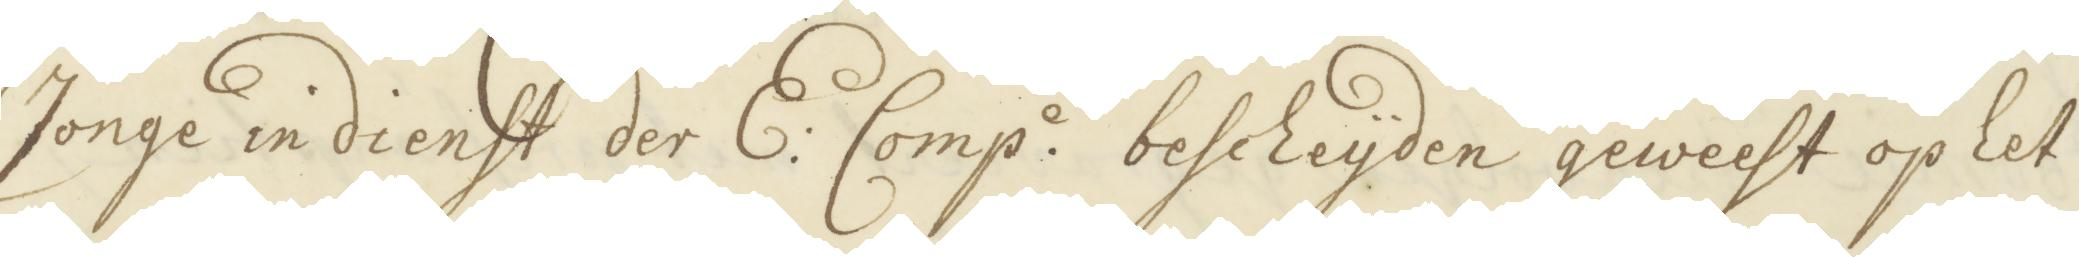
Jonge in dienst der E: Comp.e bescheijden geweest op het
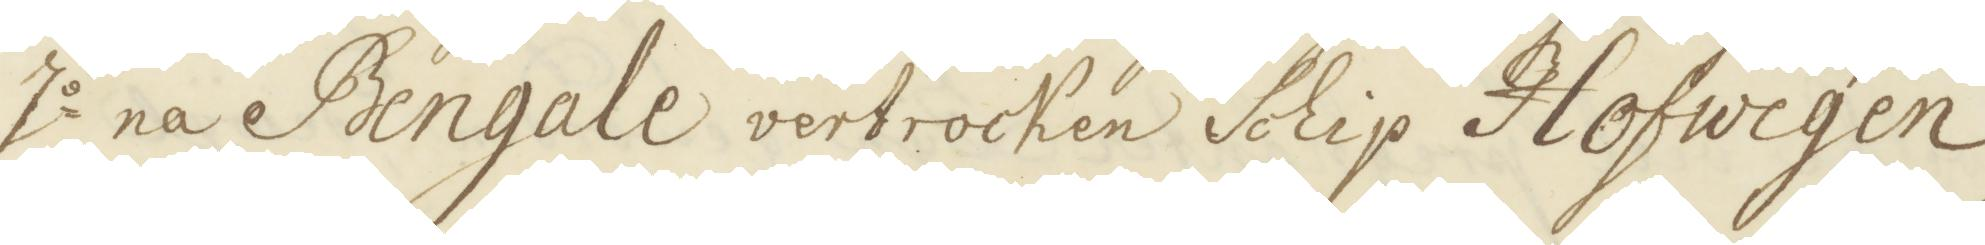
J=e na Bengale vertrocken schip Hofwegen
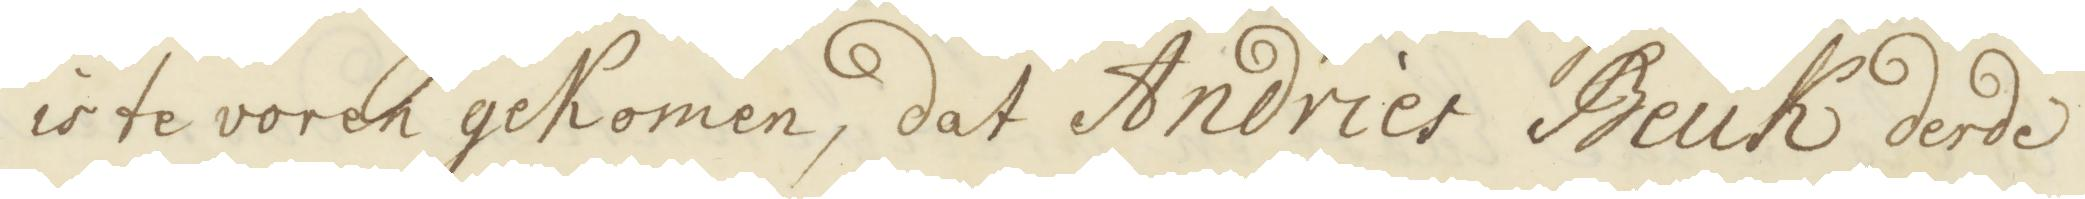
is te voren gekomen, dat Andries Beuk derde
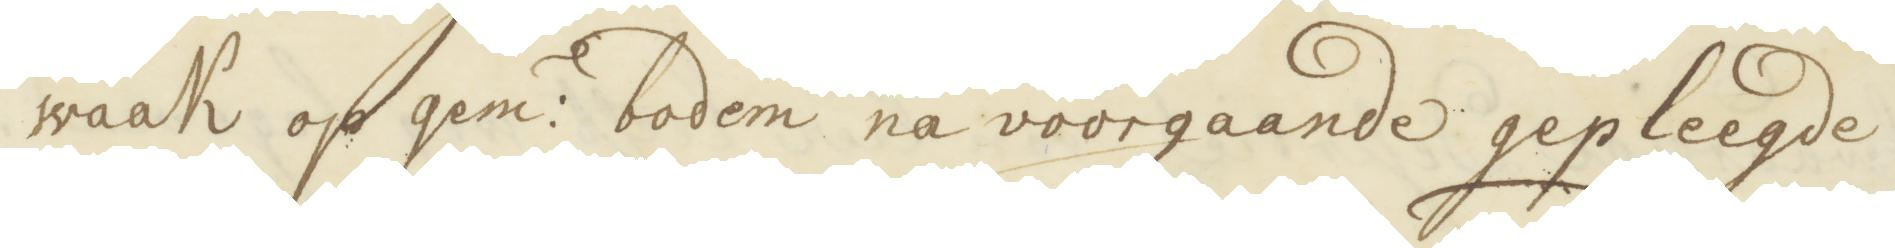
waak op gem: bodem na voorgaande gepleegde
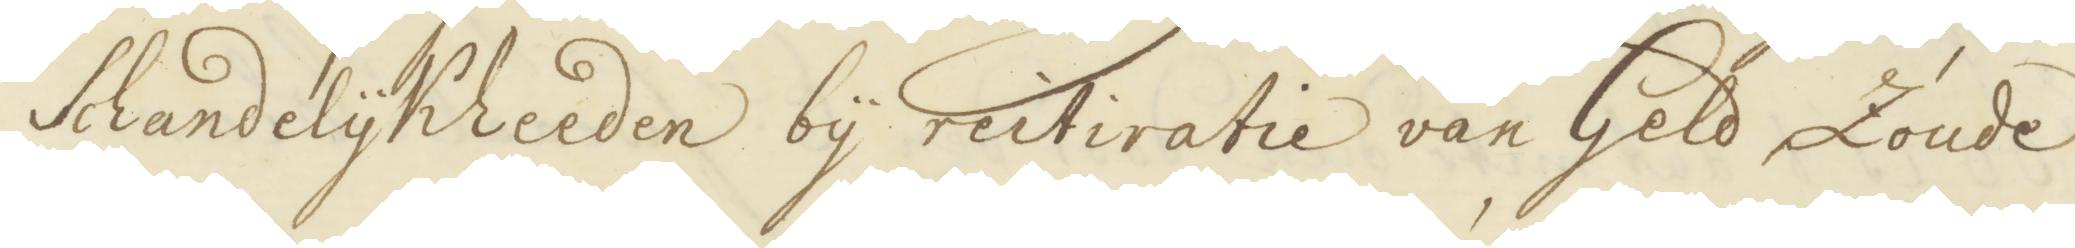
schandelijkheeden bij reitiratie van Geld zoude
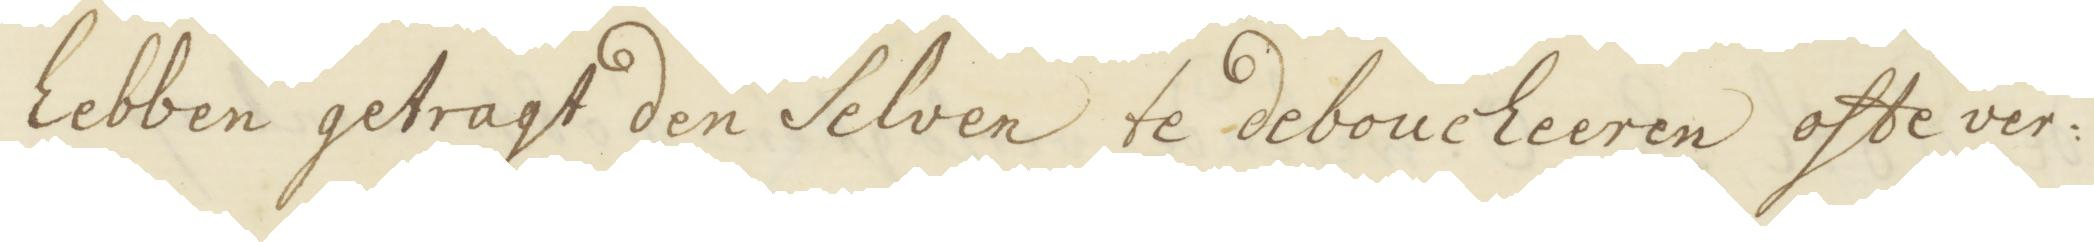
hebben getragt den selven te deboucheeren ofte ver„
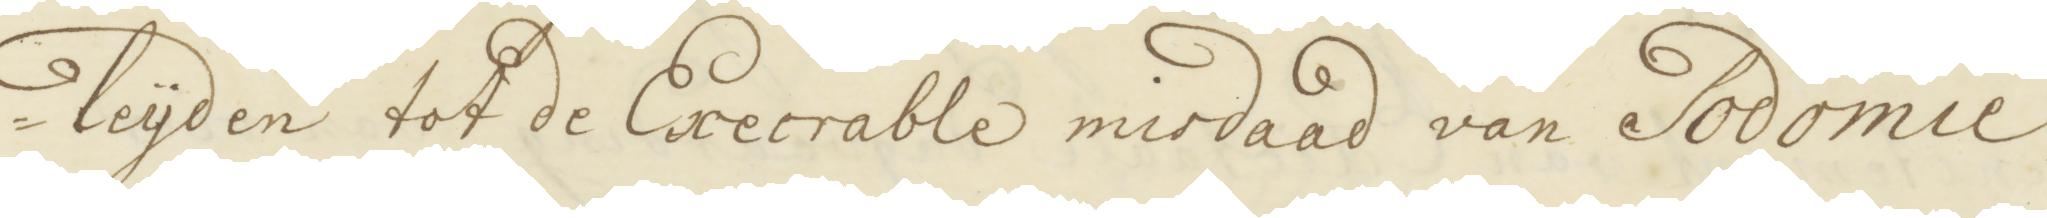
=leijden tot de Execrable misdaad van Sodomie,
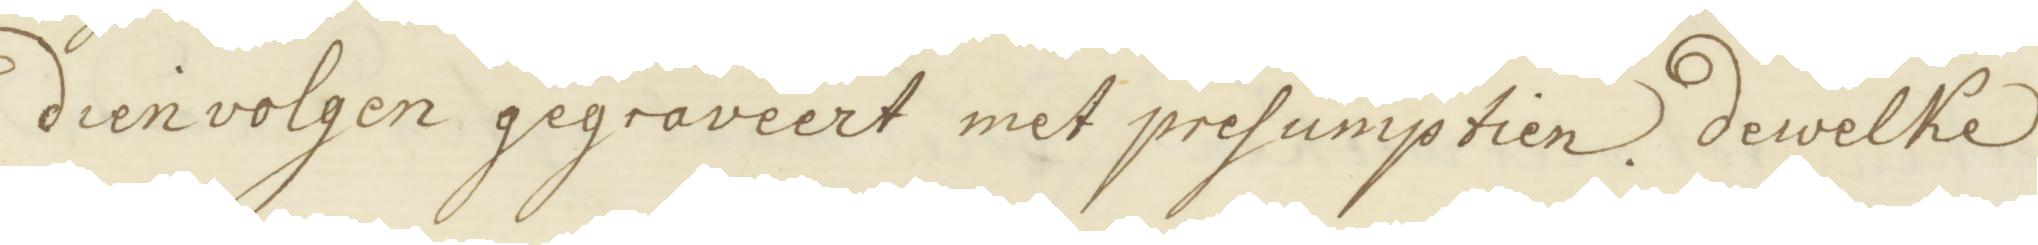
dien volgen gegraveert met presumptien. dewelke
